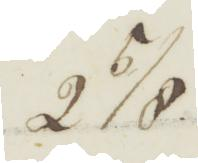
2 5/8.
